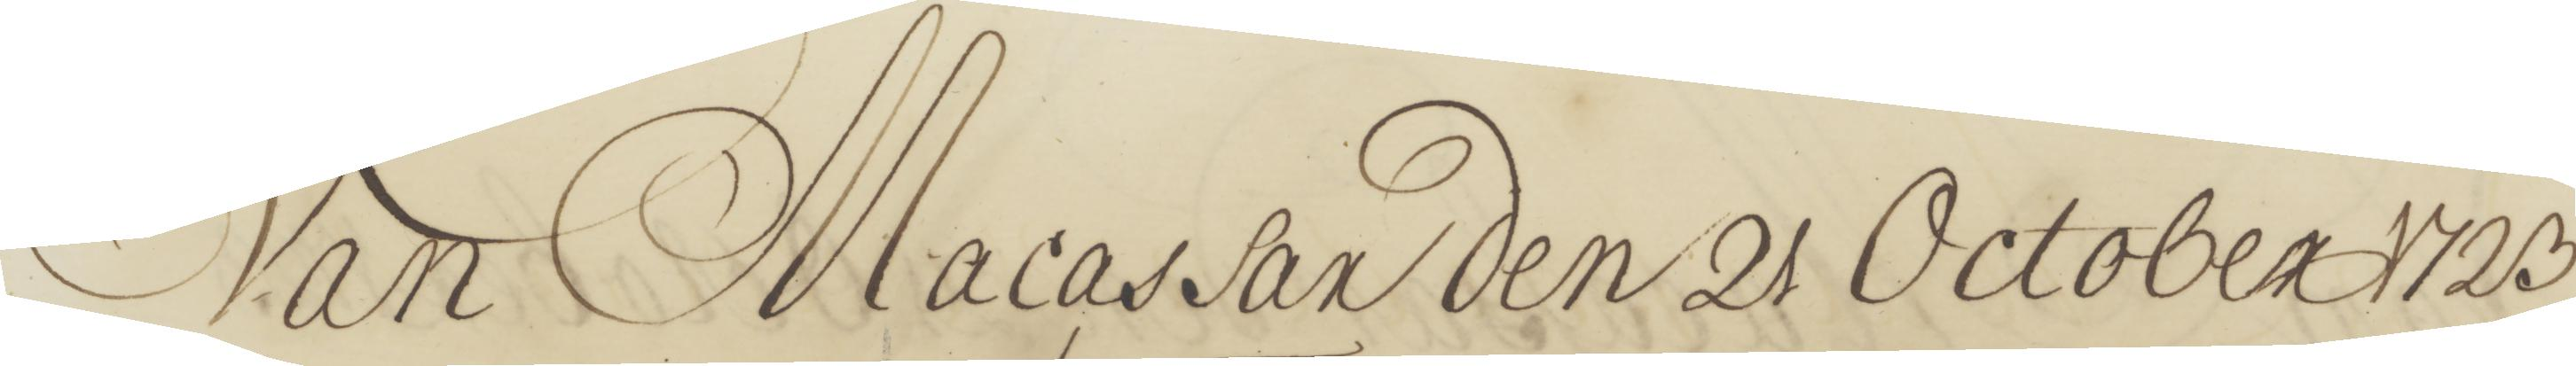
Van Macassar den 21 October 1723
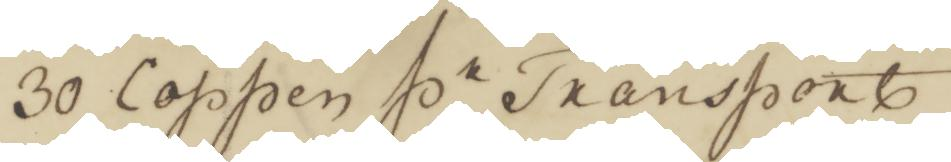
30 Coppen pr Transport
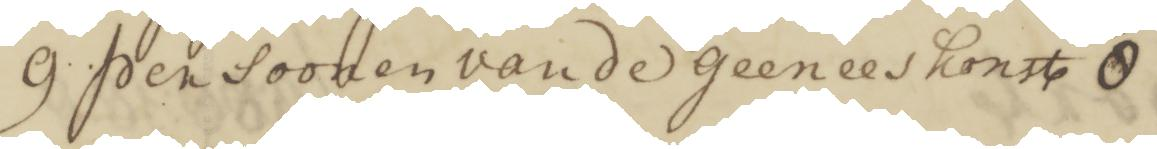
9.. per soonen vande geeneeskonst 8
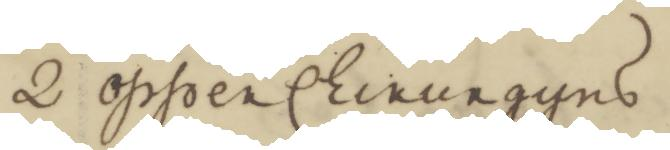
2 opper chirurgyns
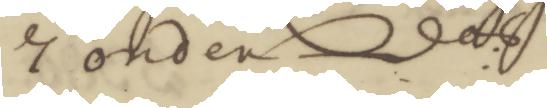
7 onder d:os
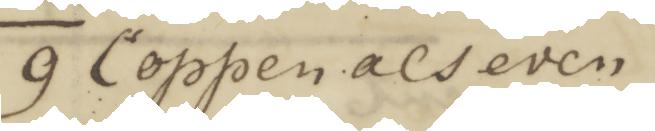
9 Coppen als even
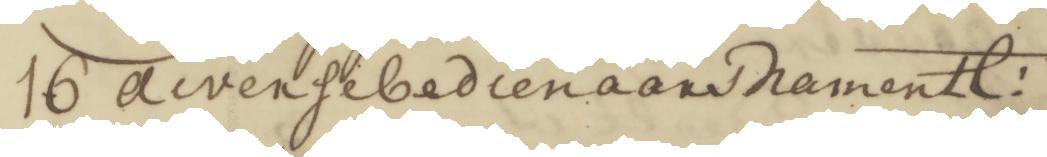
16 diverse bedienaars namentl:
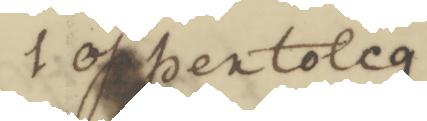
1 oppertolcq
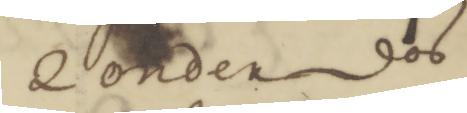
2 onder dos
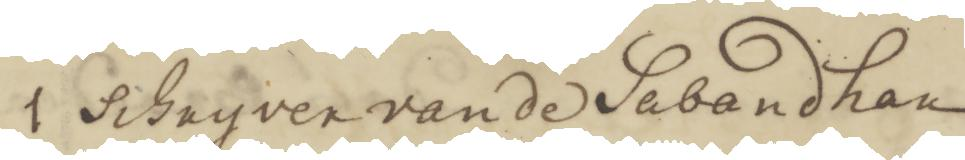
1 schryver van de Sabandhar
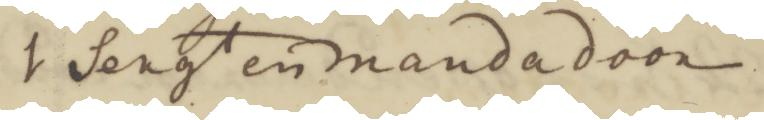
1 sergt en mandadoor
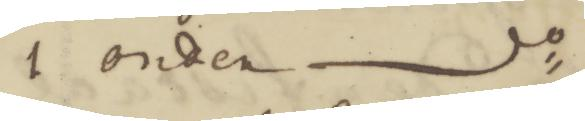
1 onder d„o
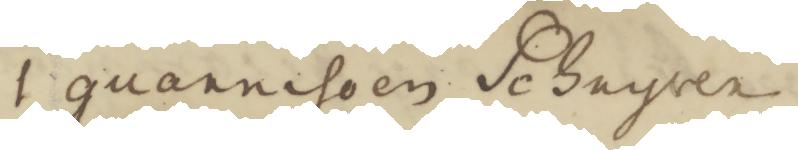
1 guarnisoen schryver
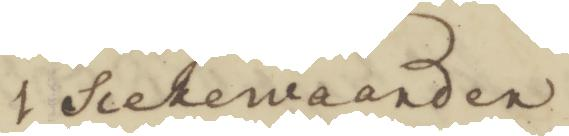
1 siekewaarder
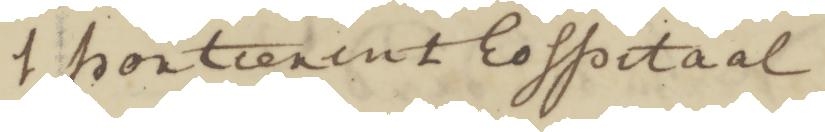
1 portier int hospitaal
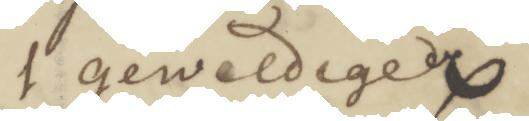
1 geweldiger
